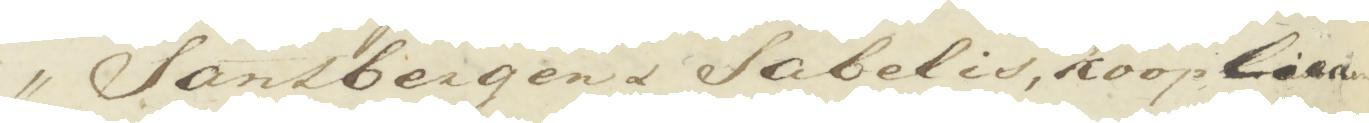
„ Santbergen & Sabelis, kooplieden
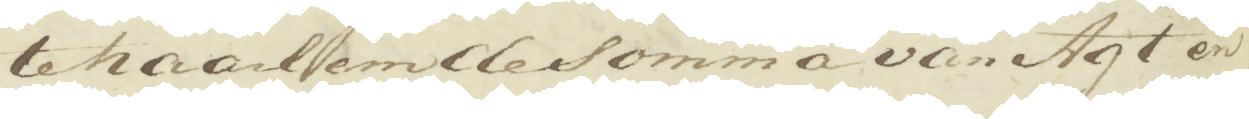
te haarlem, de somma van Agt en
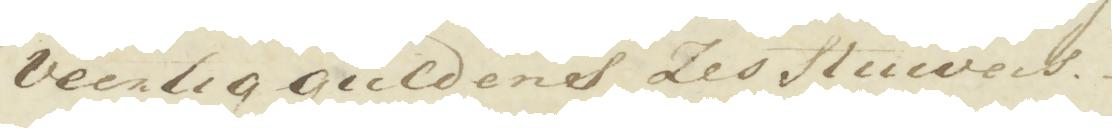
Veertig guldens Zes stuivers.
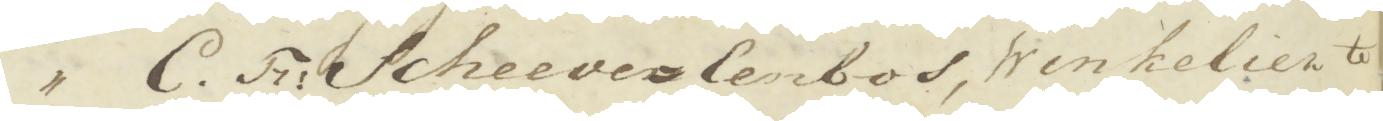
„ C. Fr: Scheevenlenbos, winkelier te
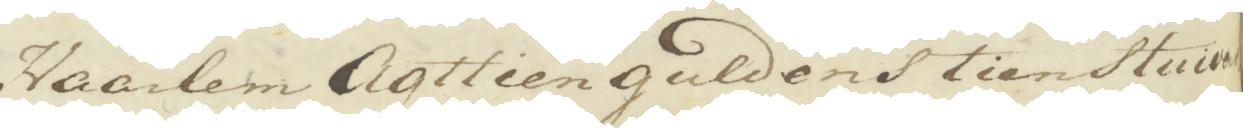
Haarlem Agttien guldens tien stuivers
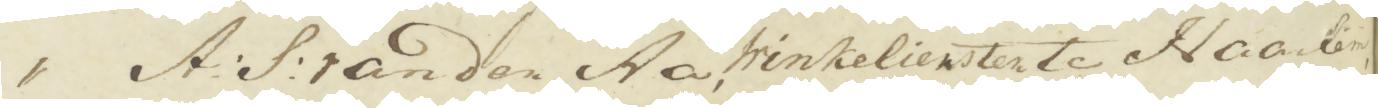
„ A: S: van der Aa, winkelierster te Haarlem,
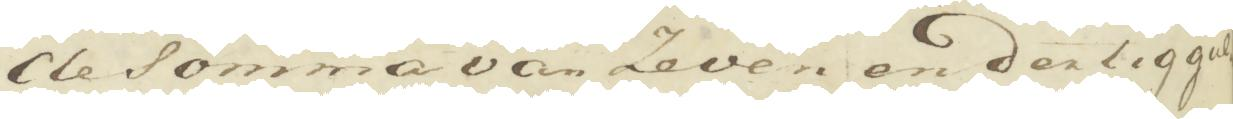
de somma van Zeven en dertig gul
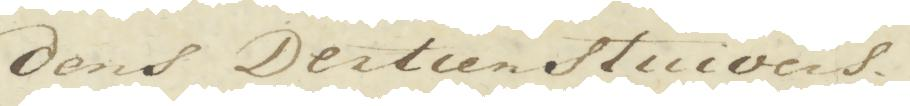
dens Dertien stuivers.
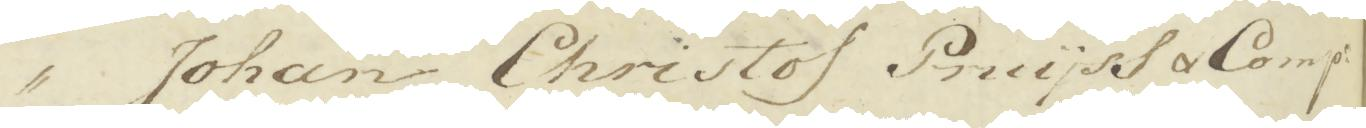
„ Johan Christof Pruijss & Comp:
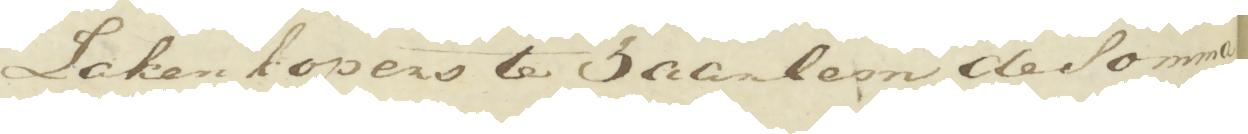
Laken kopers te Haarlem de somma
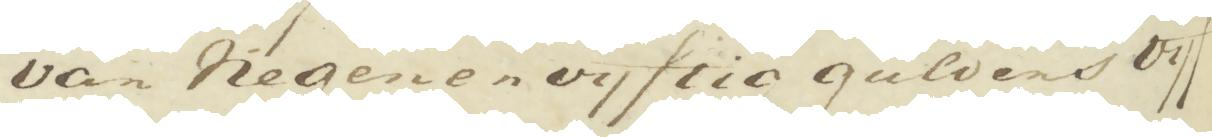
van Negenen vyftig guldens Vyf
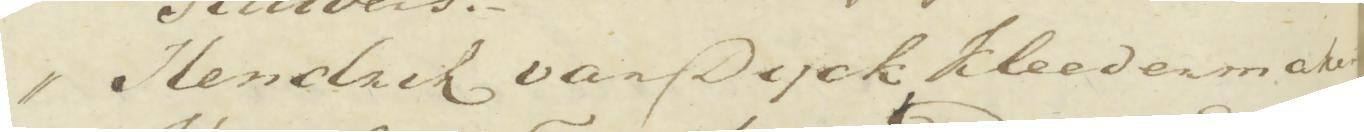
„ Hendrik van Dyck kleedermaker
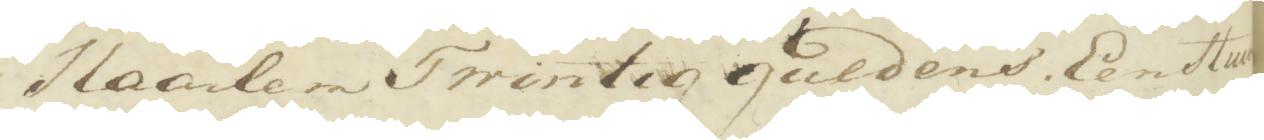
Haarlem Twintig guldens. Een stui
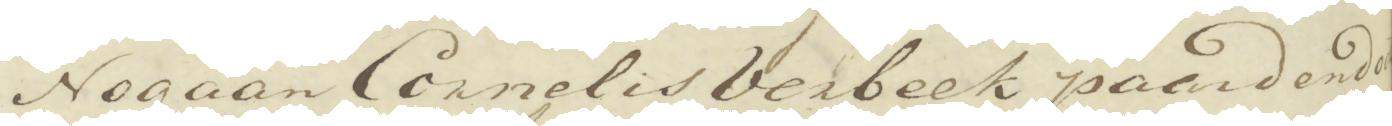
Nog aan Cornelis Verbeek paardendo
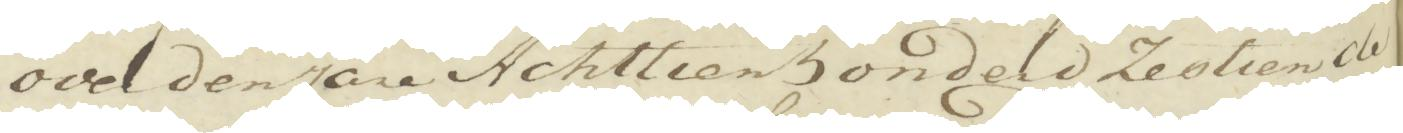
over den jare Achttien Honderd Zestien de
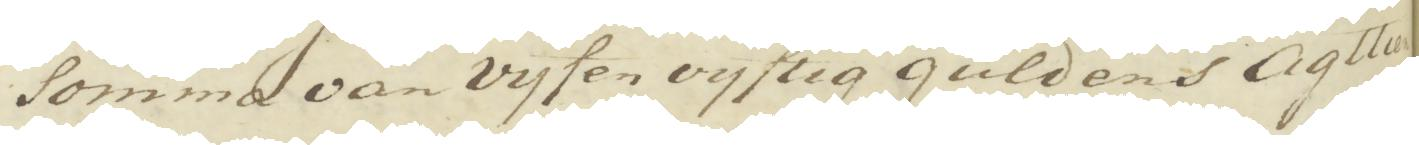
somma van vyfen vyftig guldens Agttien
